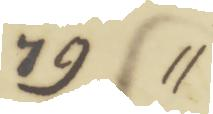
79 „
